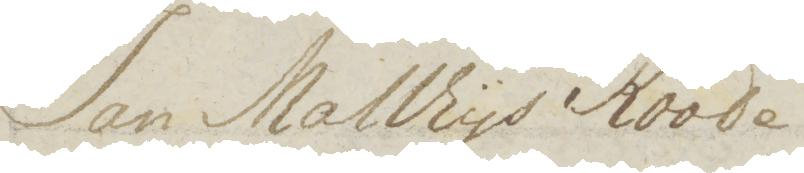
Jan Matthijs Roode
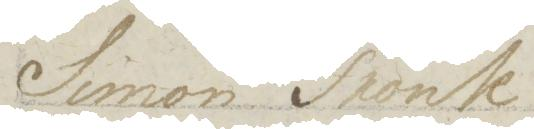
Simon Pronk
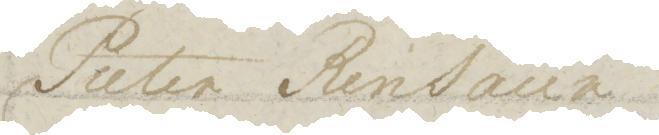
Pieter Rensaur
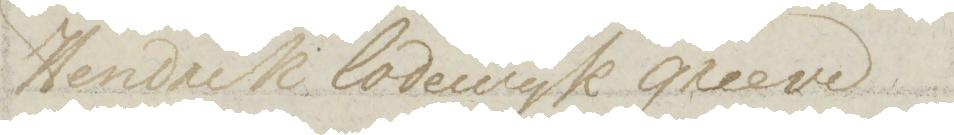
Hendrik Lodewijk Greeve
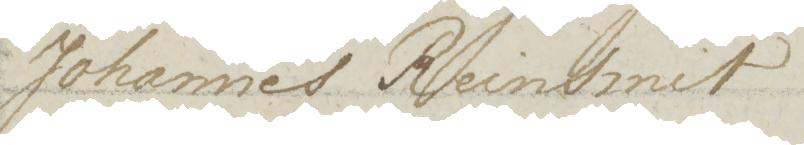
Johannes Reinsmit
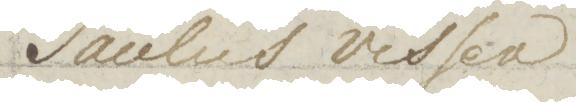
Paulus visser.
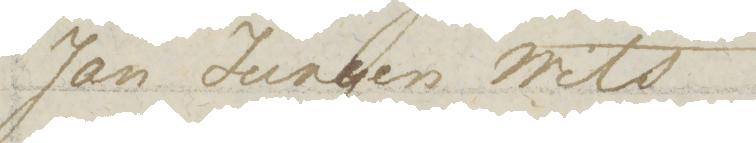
Jan Jurgen Wits
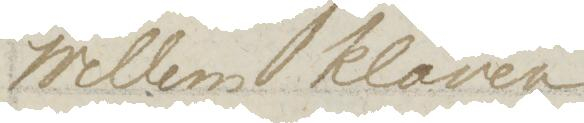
Willem Klaver
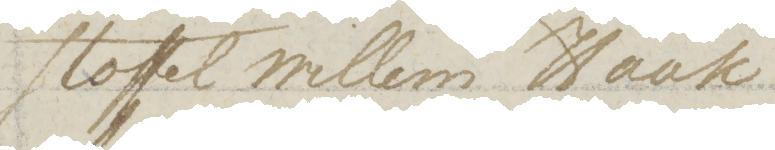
Stoffel Willem Haak
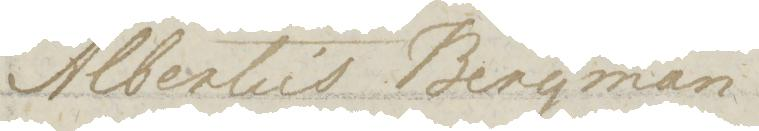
Albertus Bergman
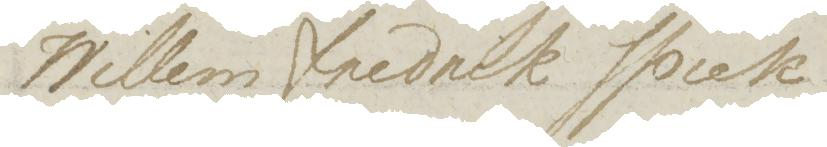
Willem fredrik Spiek
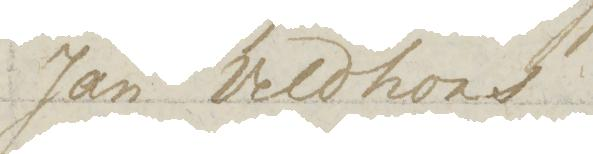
Jan Veldhors
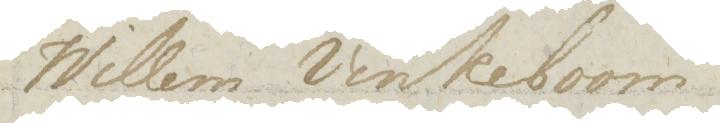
Willem Vinkeboom
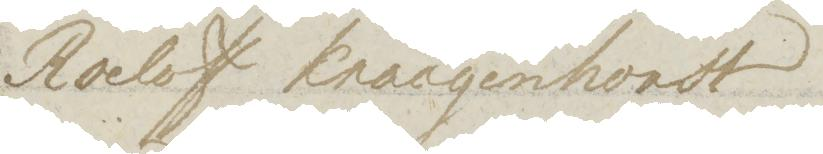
Roelof Kraagenhorst
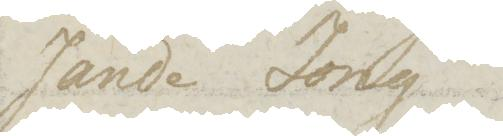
Jande jong
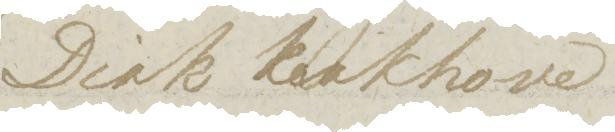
Dirk Kerkhove
